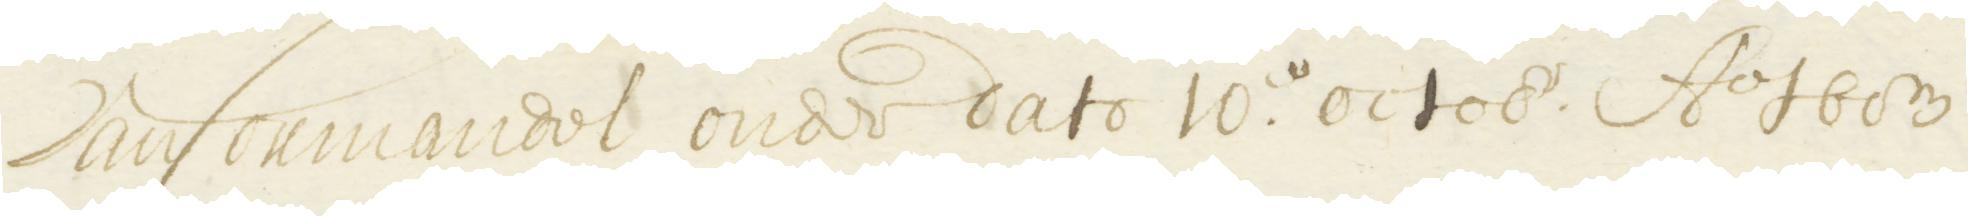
Van Cormandel onder dato 10.' octob:r Ao 1683
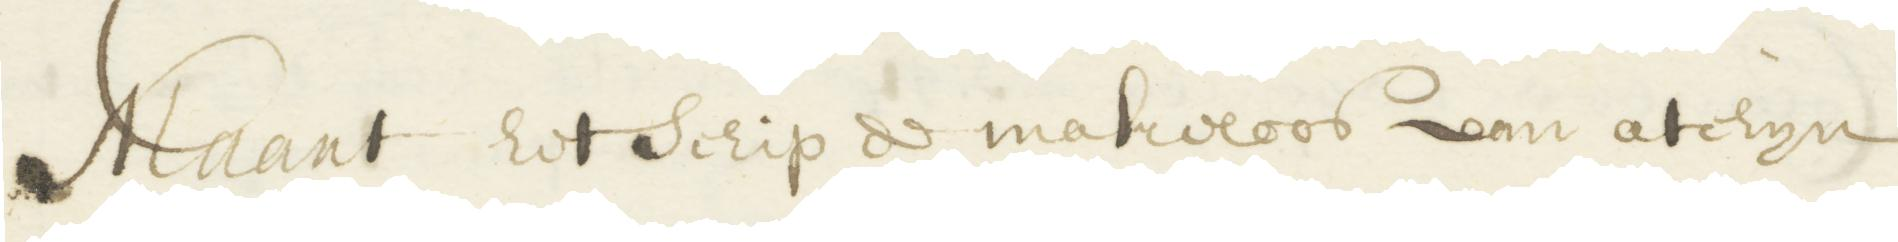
Maart het schip de makeloos van atchijn
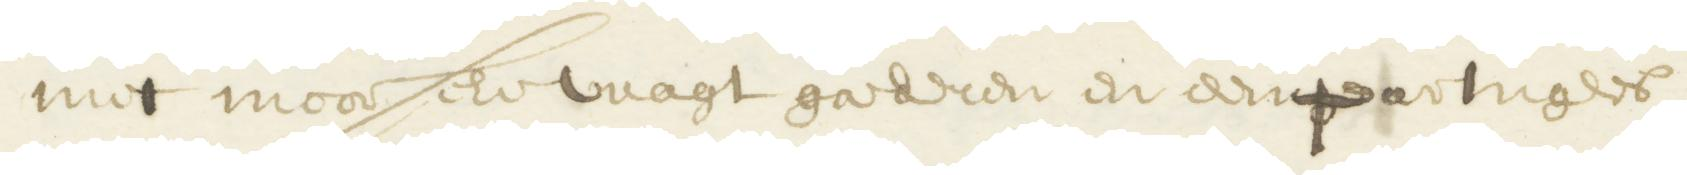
met moorsche vragt goederen en een portugees
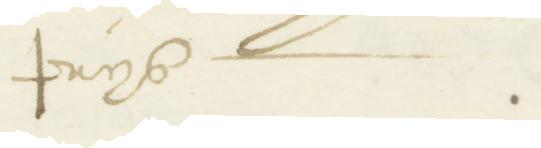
prijs.
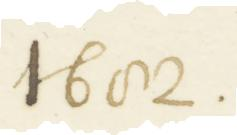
1682.
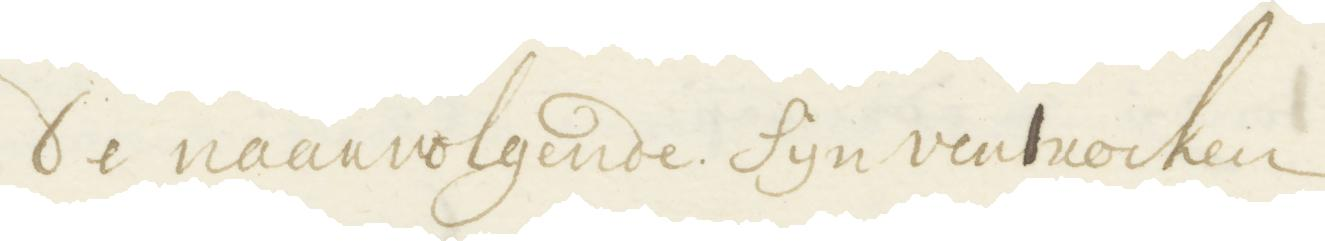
de naarvolgende. sijn vertrocken
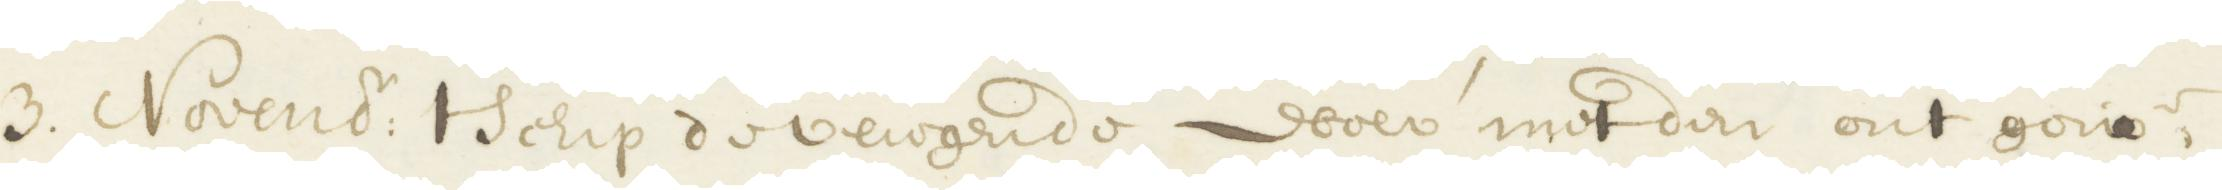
3. Novend:r tschip de vliegende wolv' met den out gouv:r
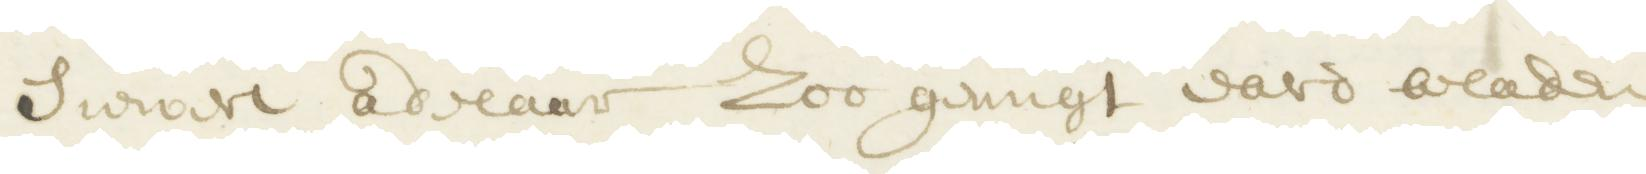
siewert adelaar zoo geingt werd beladen
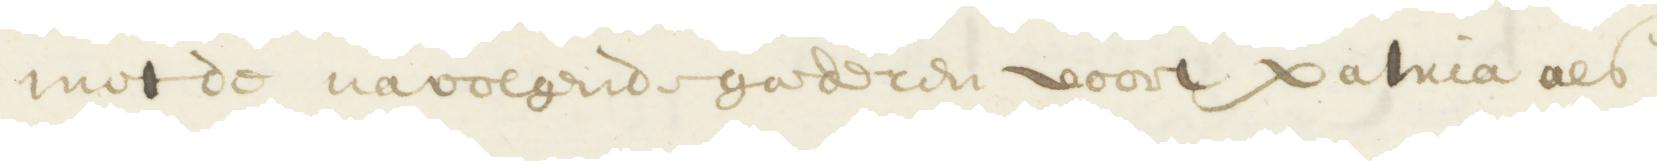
met de navolgende goederen voort patria als
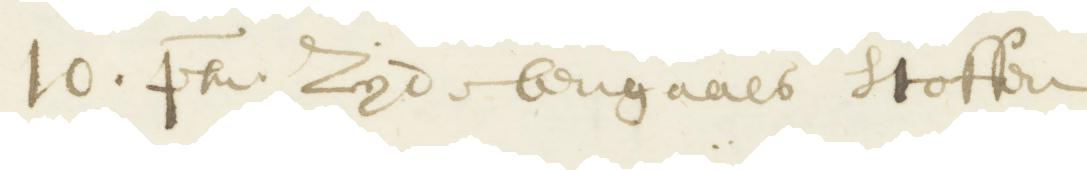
10. pk: zijde bengaals stoffen
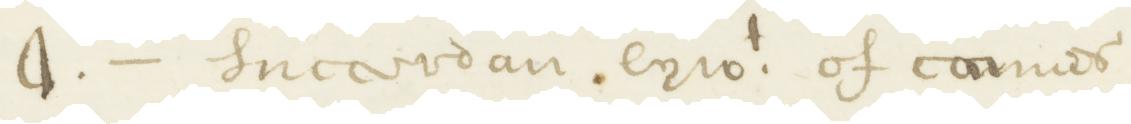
4.— succerdan . lijw.t of camies
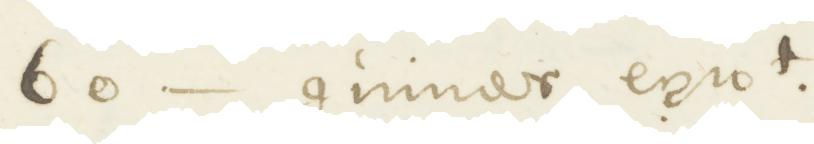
60 .— guinees lyw.t
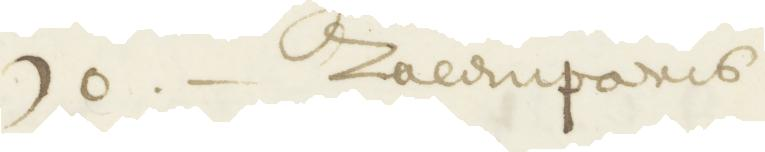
70. — Zalemporis
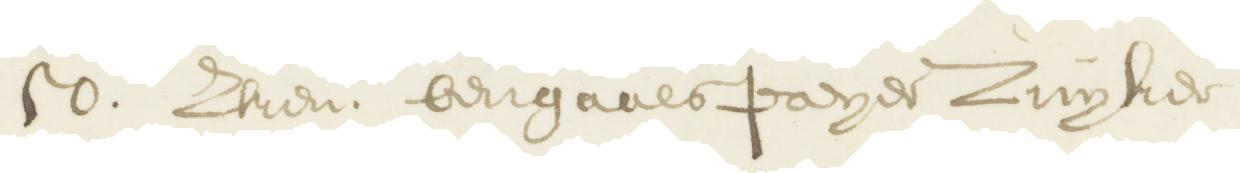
50. Zken. bengaals poeijer Zuijker
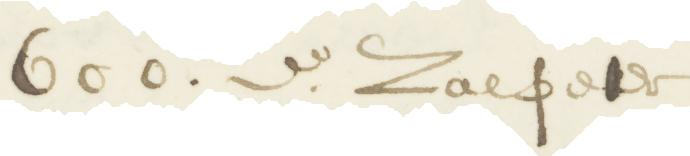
600. _.o Zalpeter
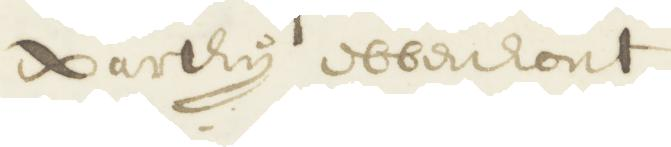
parthij ebbenhout
